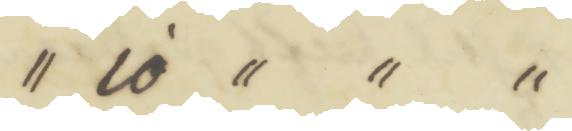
„ 10 „ „ „
